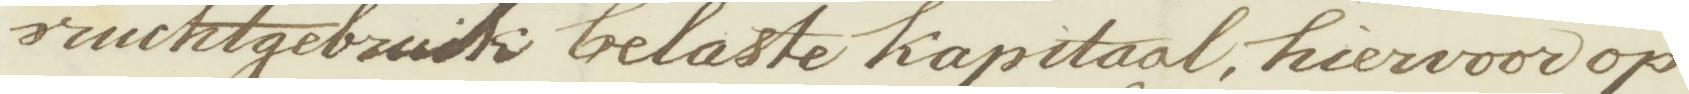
vruchtgebruik belaste kapitaal, hiervoor op
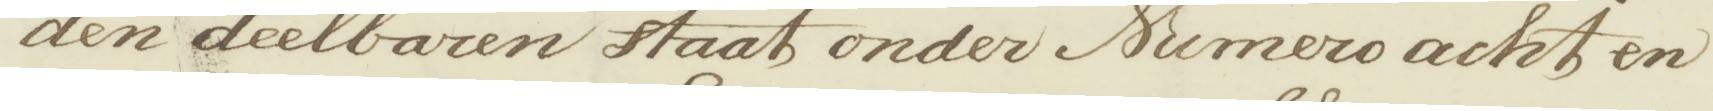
den deelbaren staat onder Numero acht en
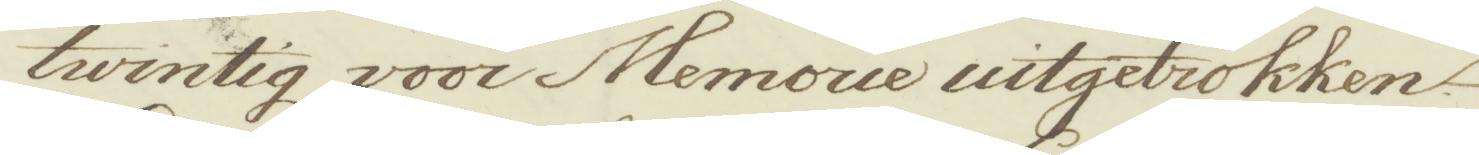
twintig voor Memorie uitgetrokken.
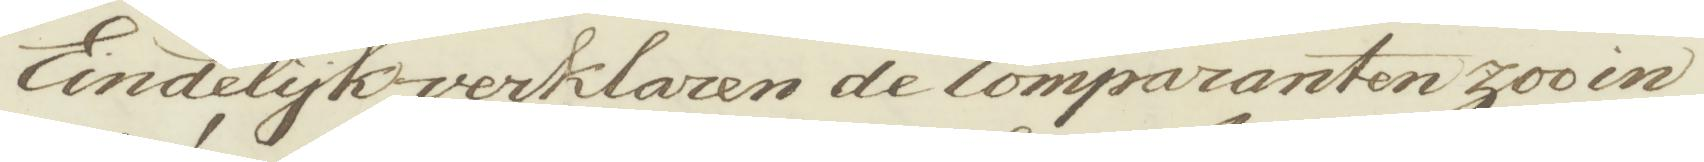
Eindelijk verklaren de Comparanten zoo in
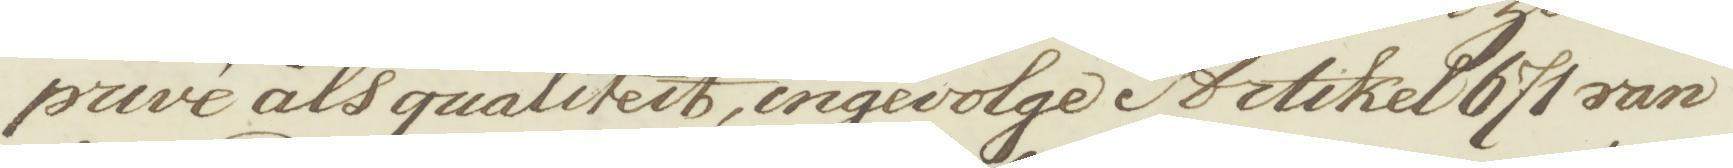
privé als qualiteit, ingevolge Artikel 671 van
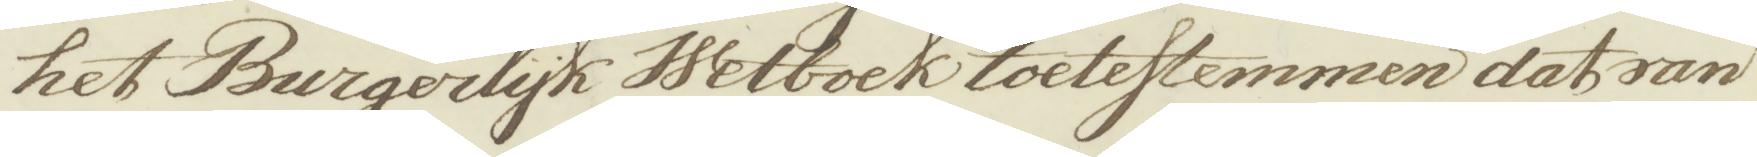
het Burgerlijk Wetboek toetestemmen dat van
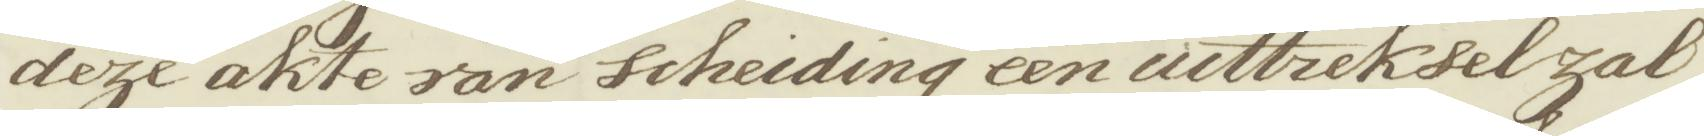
deze akte van scheiding een uittreksel zal
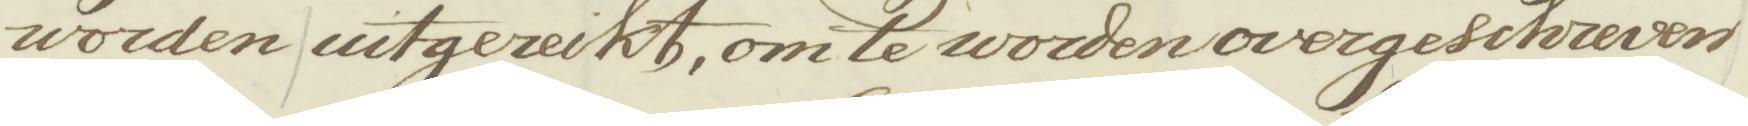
worden uitgereikt, om te worden overgeschreven
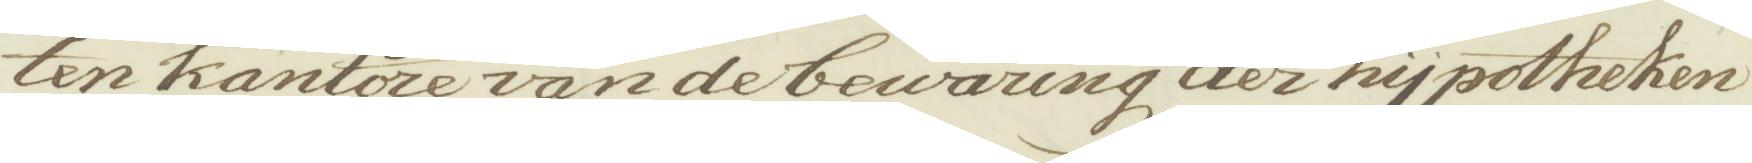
ten kantore van de bewaring der hijpotheken
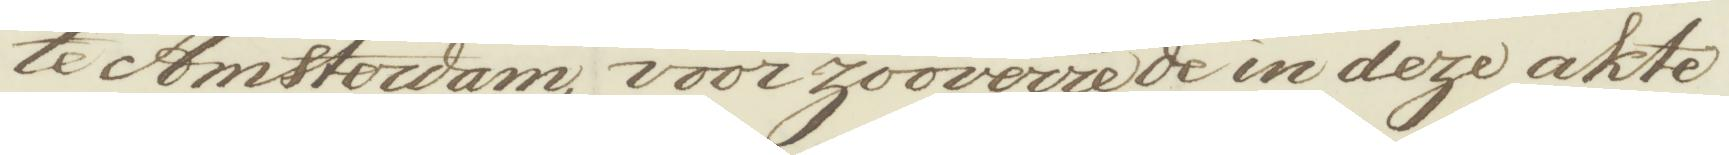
te Amsterdam, voor zooverrede in deze akte
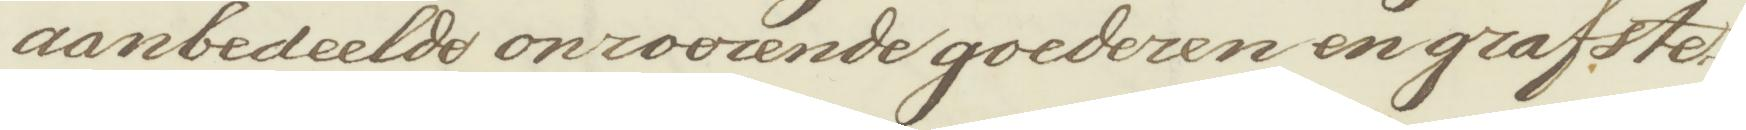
aanbedeelde onroerende goederen en grafste,
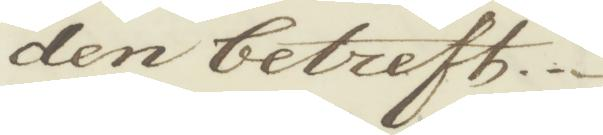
den betreft.--
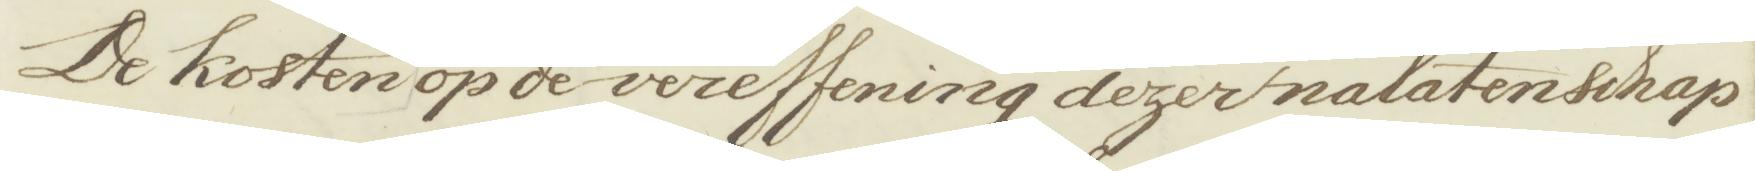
De kosten op de vereffening dezer nalatenschap
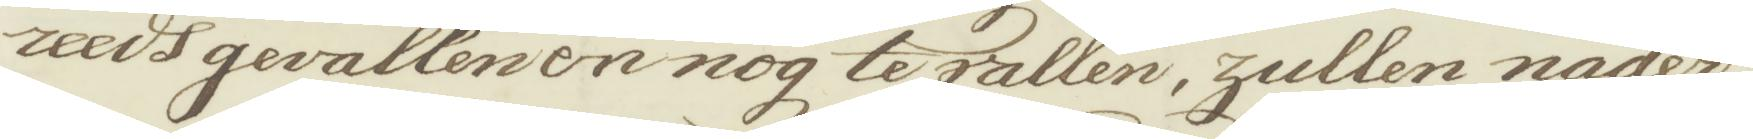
reeds gevallen en nog te vallen, zullen nader
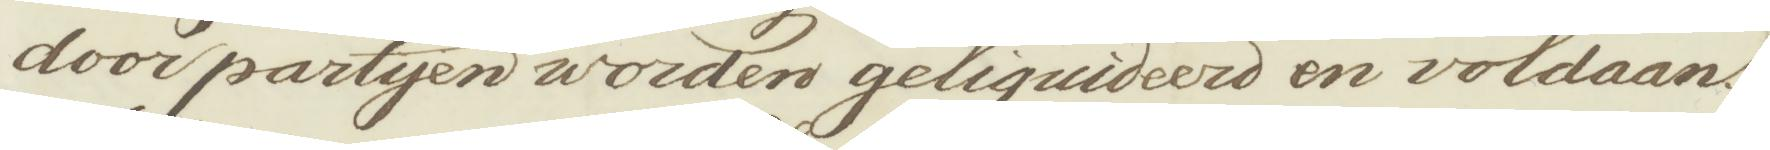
door partijen worden geliquideerd en voldaan.
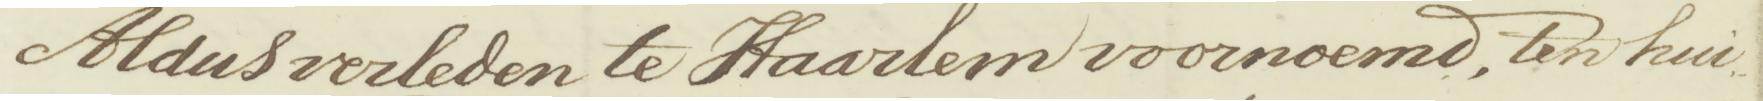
Aldus verleden te Haarlem voornoemd, ten hui„
